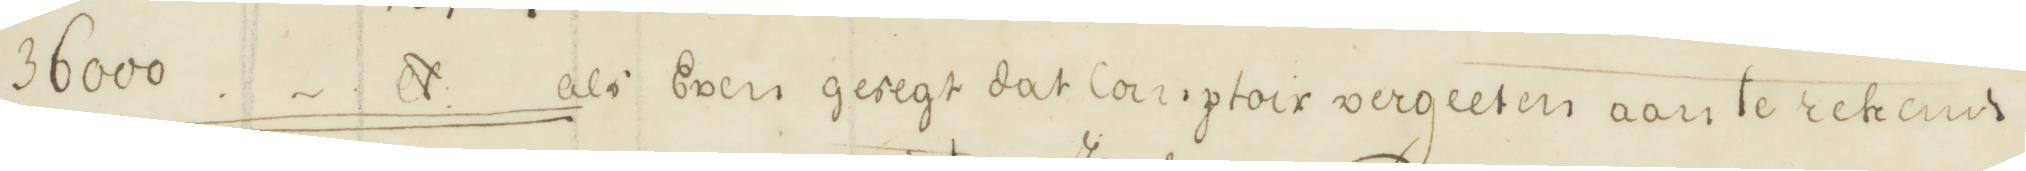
36000 — lb: als Even gesegt dat comptoir vergeeten aan te rekenen
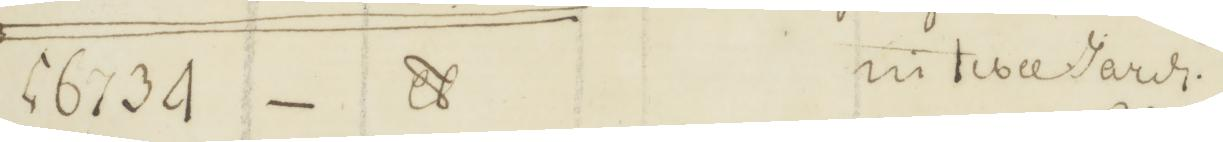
56734 — lb in twee Iaren.
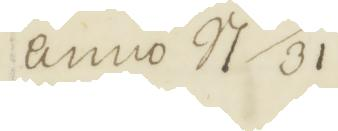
anno 17 30 /en31
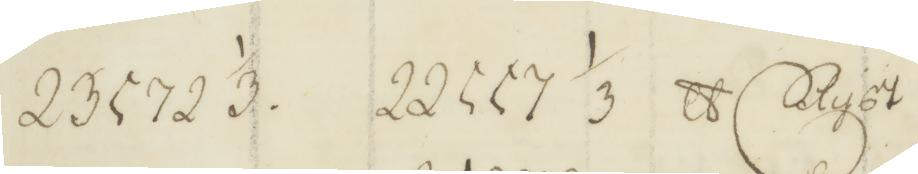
23572 1/3. 22557 1/3 lb Rijst
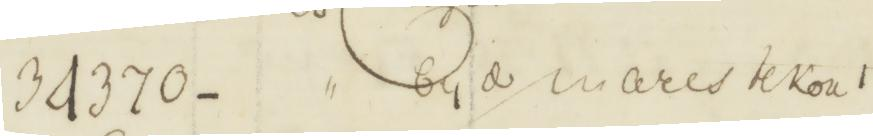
34370 — „ by de mares tekort
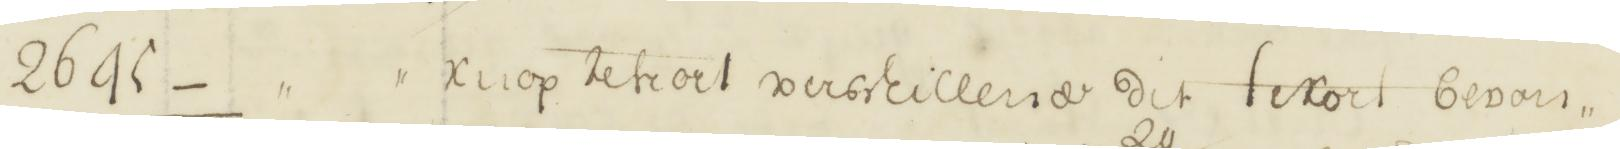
2645 — „ „ Knop tekort verschillende dit tekort bevon„
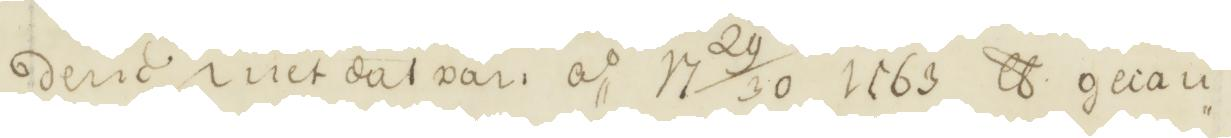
dene met dat van a„o 17 29/30 1563 lb: gecau„
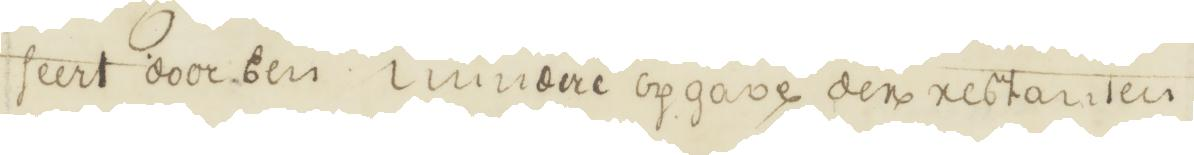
seert door Een mindere opgave der restanten
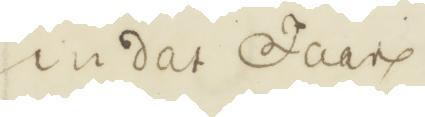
in dat Jaare
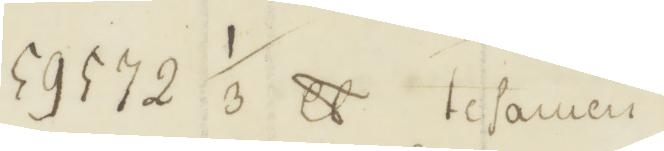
59572 1/3 lb tesamen
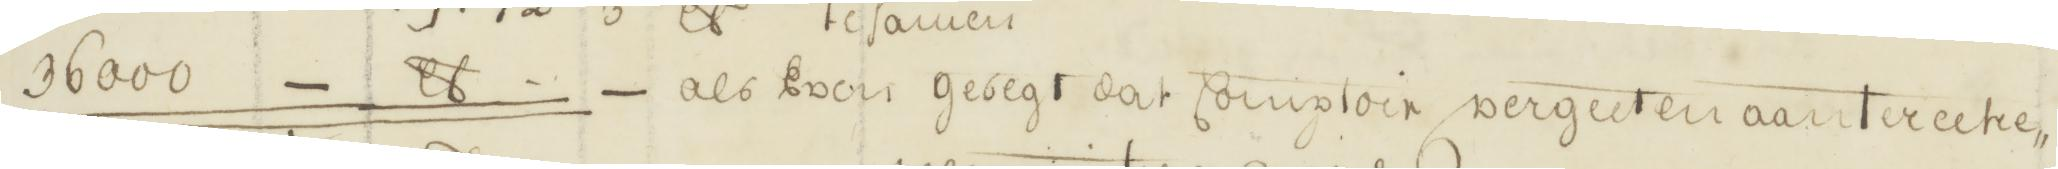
36000 — lb — als Even gesegt dat Comptoir vergeeten aantereeke„
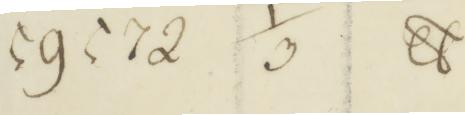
59572 1/3 lb:
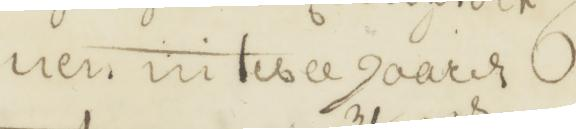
nen in twee Jaaren
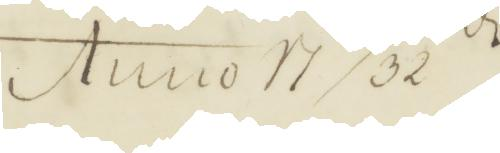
Anno 17 31/en32
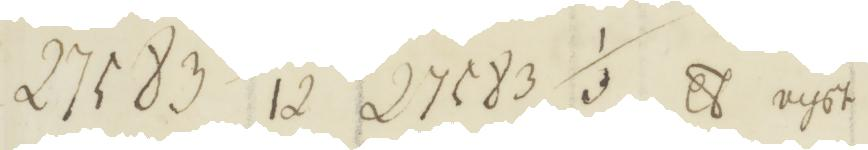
27583 7/12 27583 1/3 lb ryst
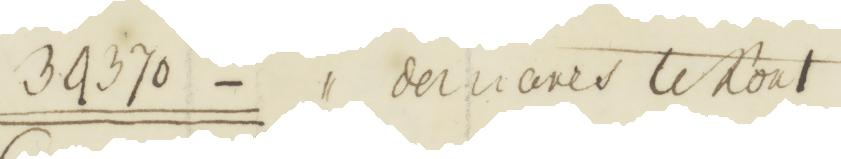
34370 — „ demares tekort
